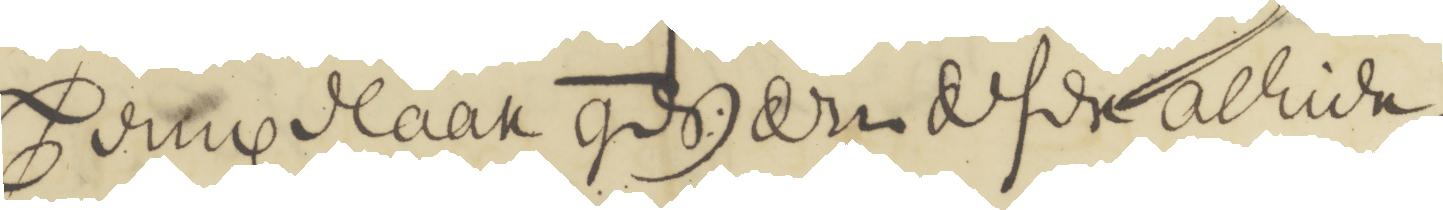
Tempelaar gelijk den deser alhier
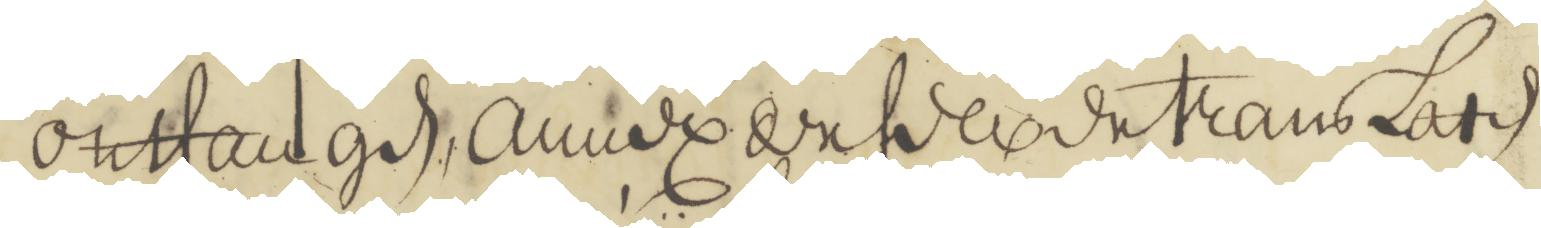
ontfangen, annex der selver translaten
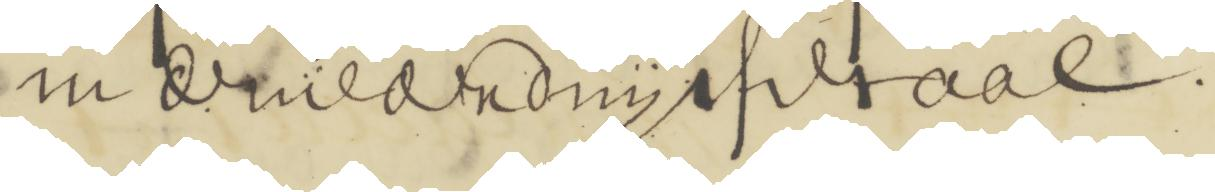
in de nederduijtsetaal.
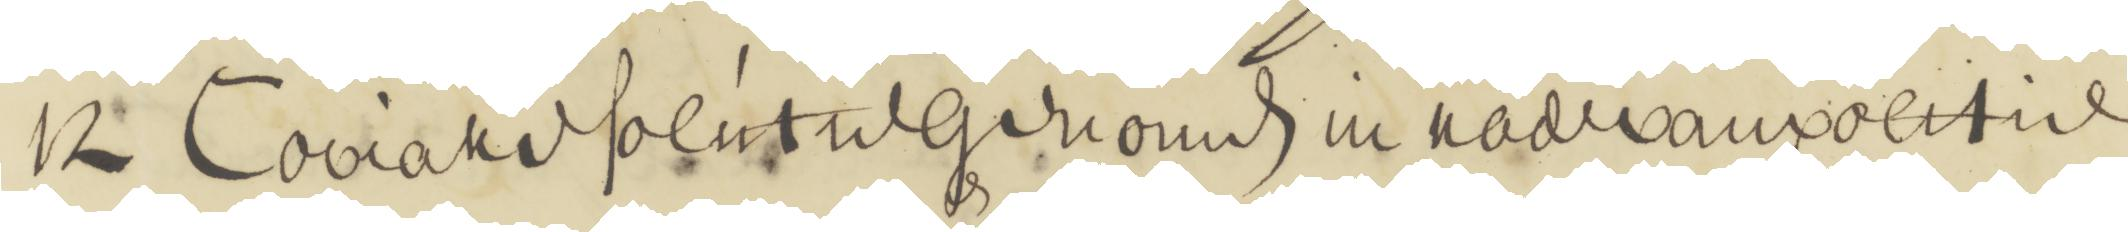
12 Copiaresolutie genomen in rade van politie
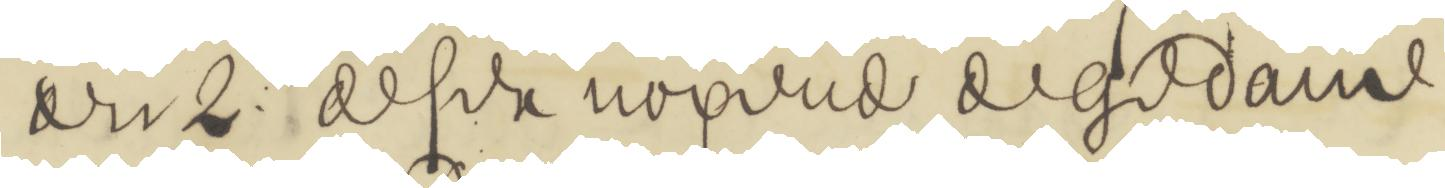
den 2:en deser nopende de gedane
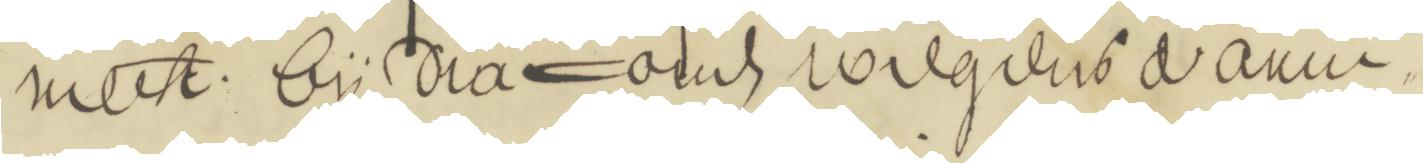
reek bij diaconen wegens de arm„
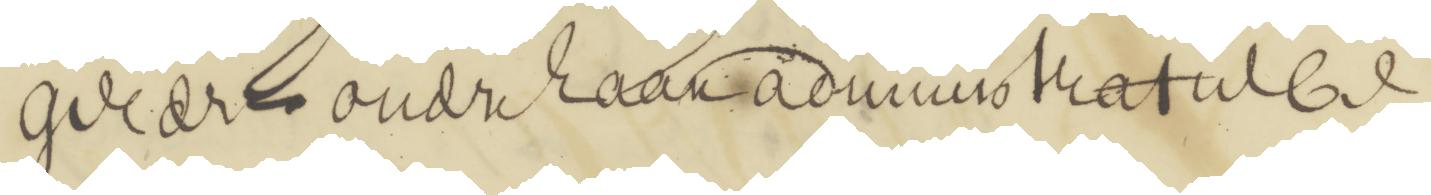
gelden onder haar administratie be
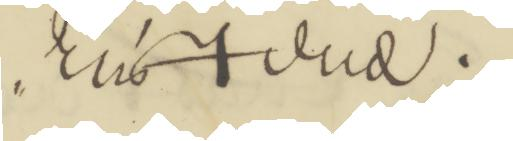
„rustende.
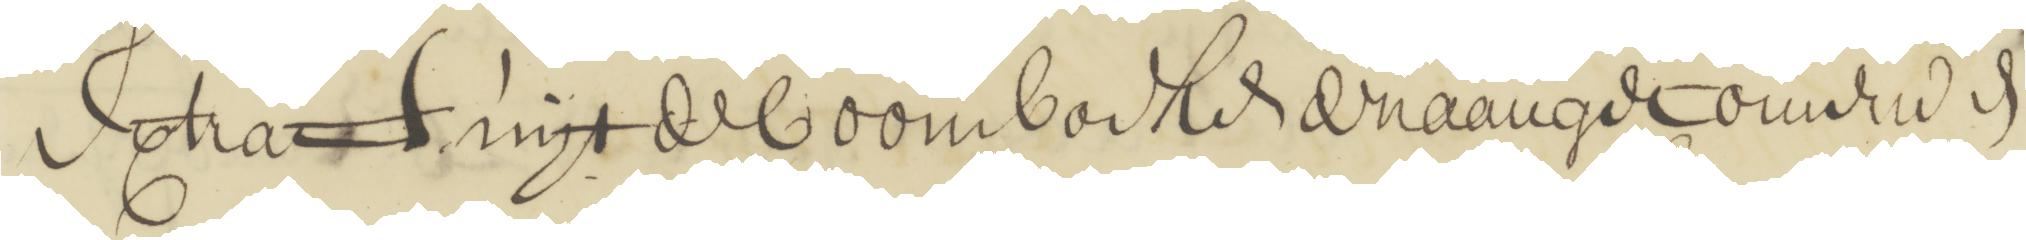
13 Extract uijt de boomboeken den aangecomene en
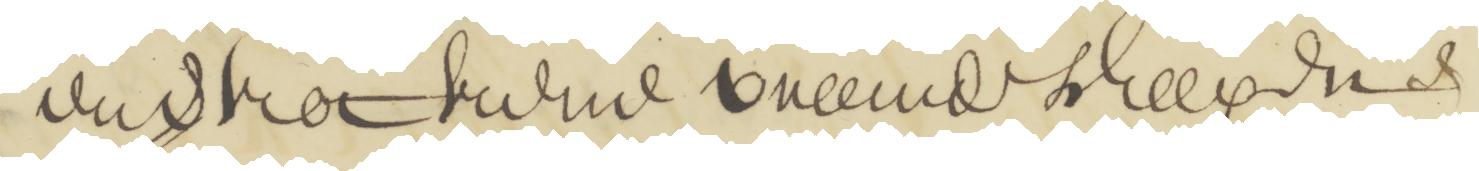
en vertrockene vreemde scheepen en
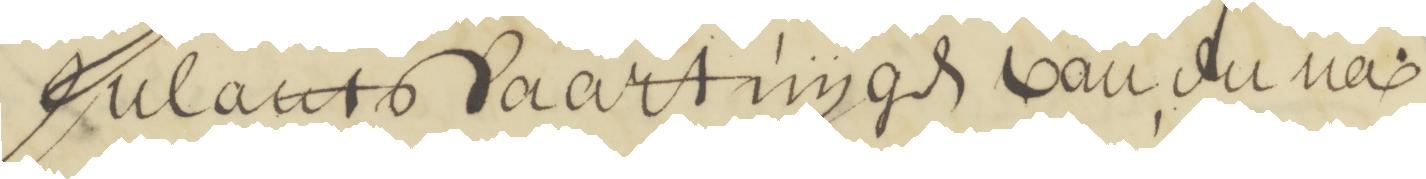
jnlants vaartuijgen van en na
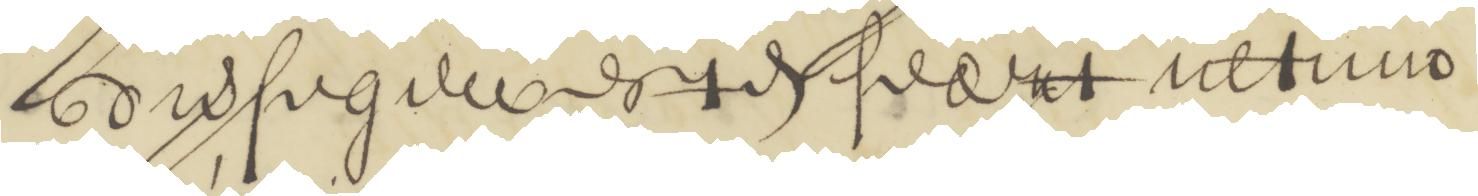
diverse gewesten sedert ultimo
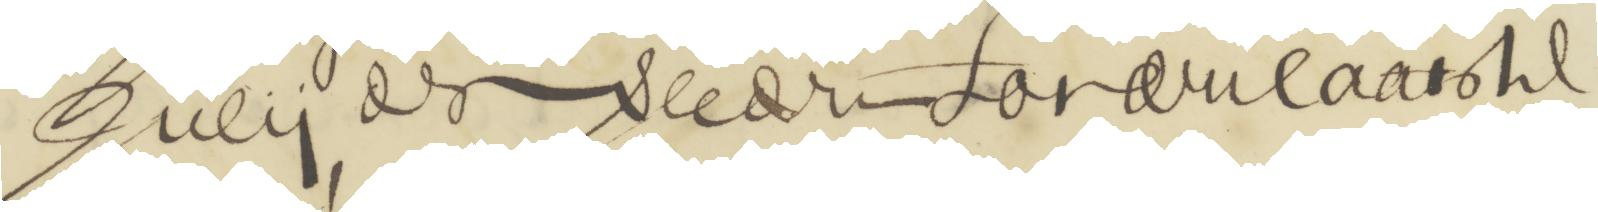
Julij des verleden tot den laatste
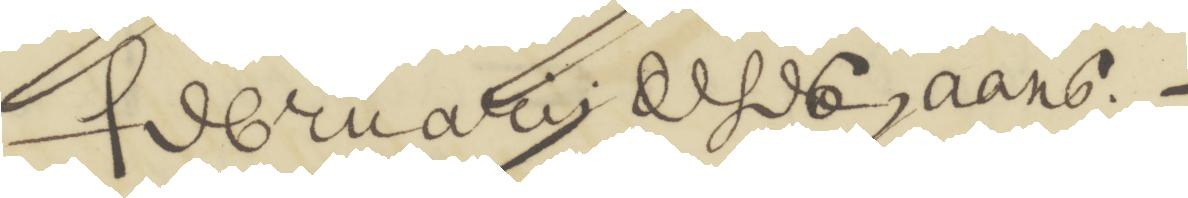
februarij deses jaars.
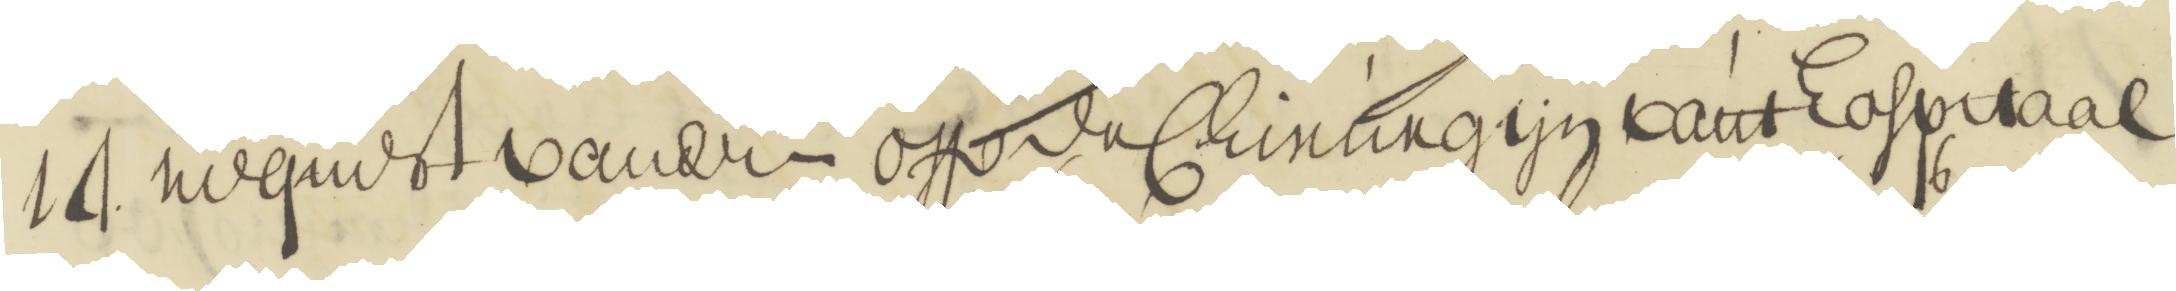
14. request van den opperchirurgijn van't hospitaal
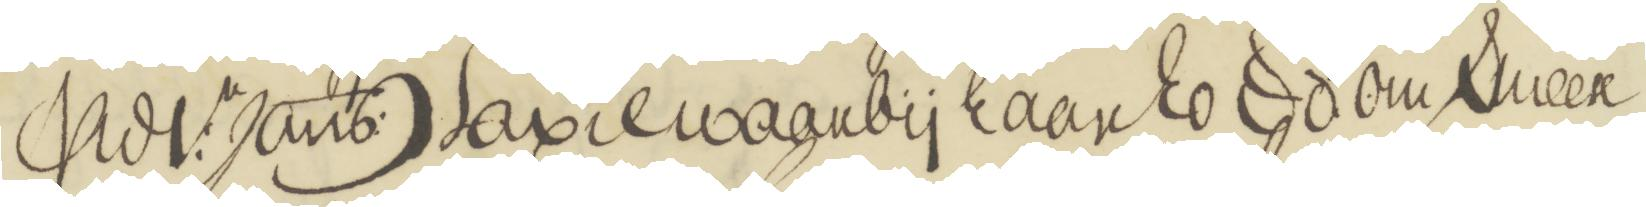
Piet:r Jans: taxil waarbij haar ho Eds om vermeer
